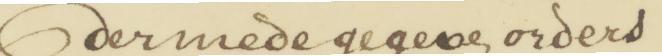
der mede gegeven orders
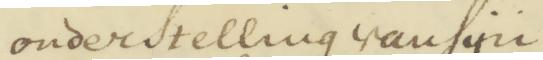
onderstelling van sijn
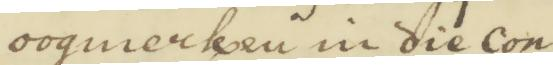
oogmerken in die con
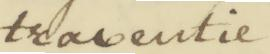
traventie
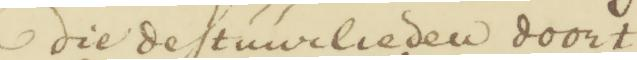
die de stuurlieden door ’t
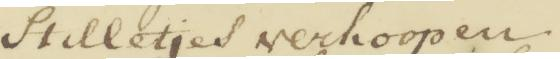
stilletjes verkoopen
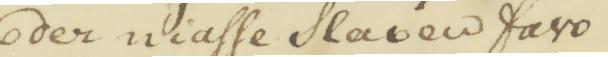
der niasse slaven favo
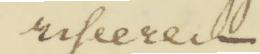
riseeren
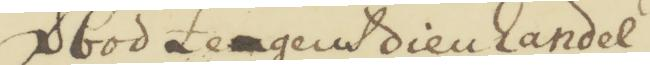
verbod tegens dien handel
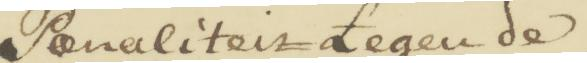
Pænaliteit tegen de
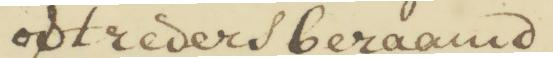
overtreders beraamd
